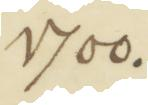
1700.
